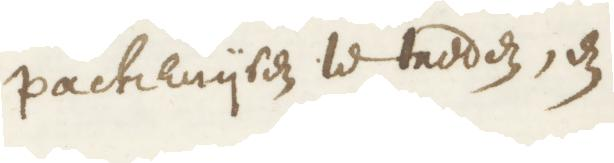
packhuijsen te treden, en
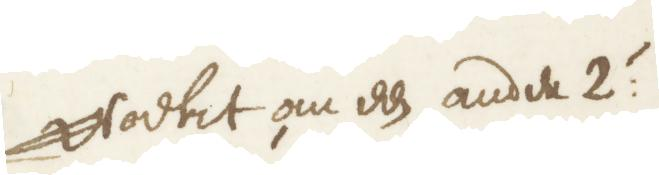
versoekt om een ander 2:'
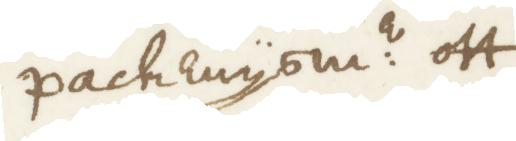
packhuijsm:r off
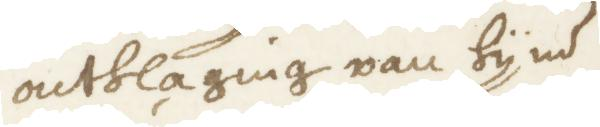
ontslaging van sijne
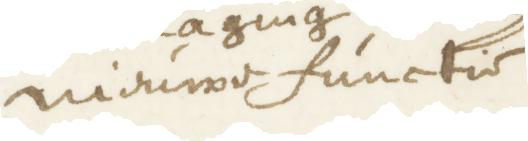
nieuwe functie
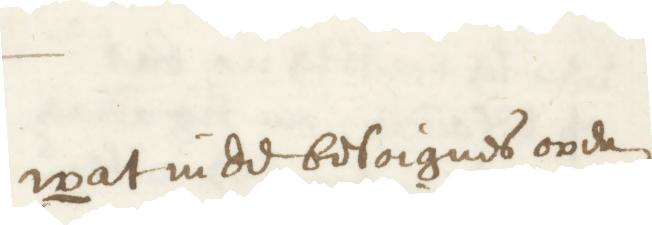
wat in de besoignes over
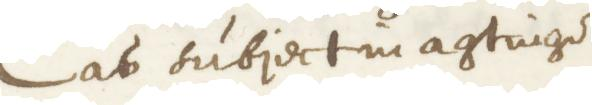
Cas subject in agtinge
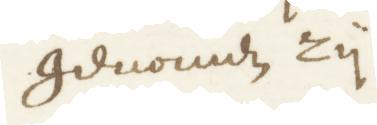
genomen zij
